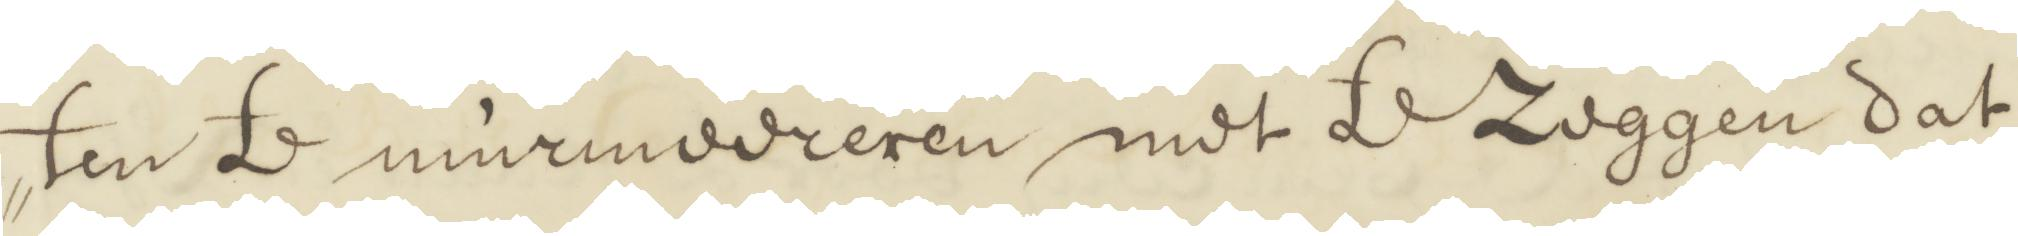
„ten te murmeereren met te zeggen dat
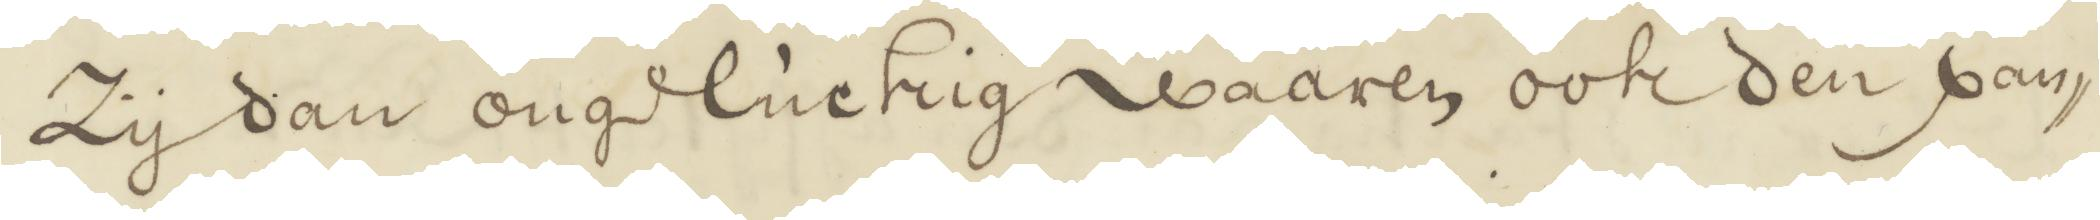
zij dan ongeluckig waaren ook den pan„
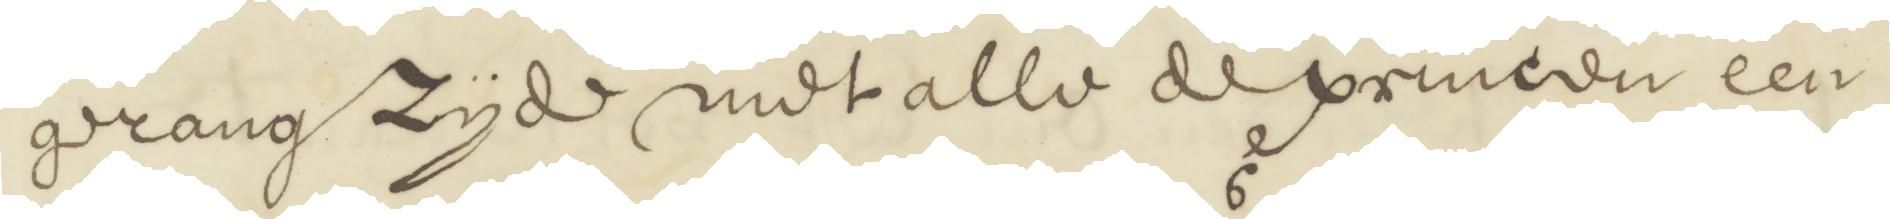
gerang zijde met alle de princen een
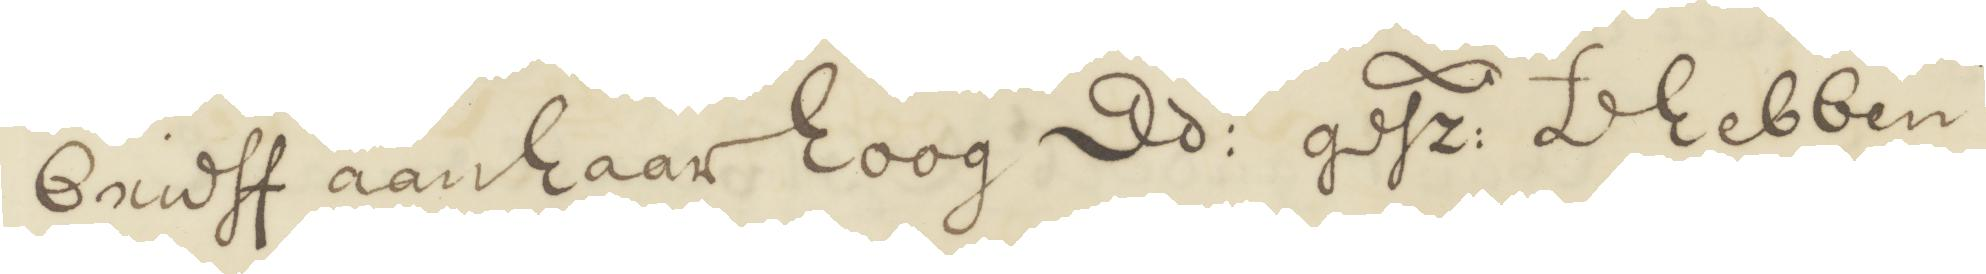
brieff aan haar hoog Ed: gesz: te hebben
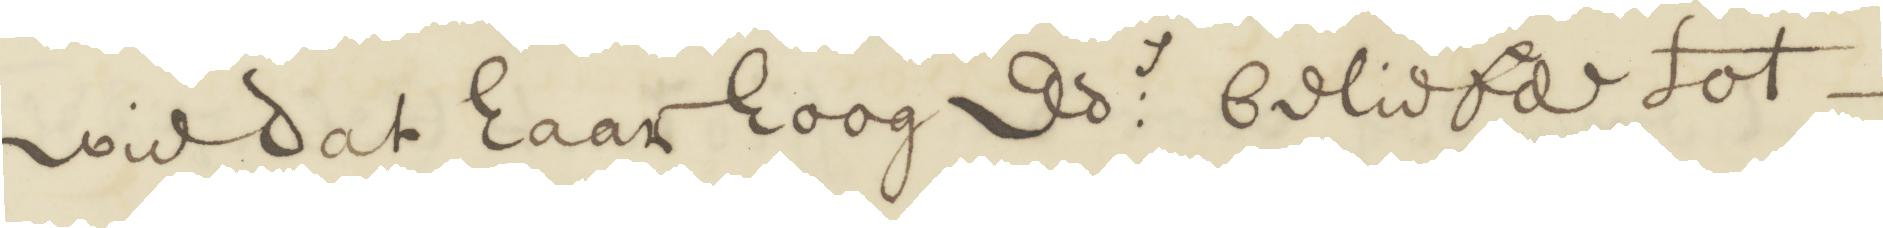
wie dat haar hoog Ed:s beliefde tot
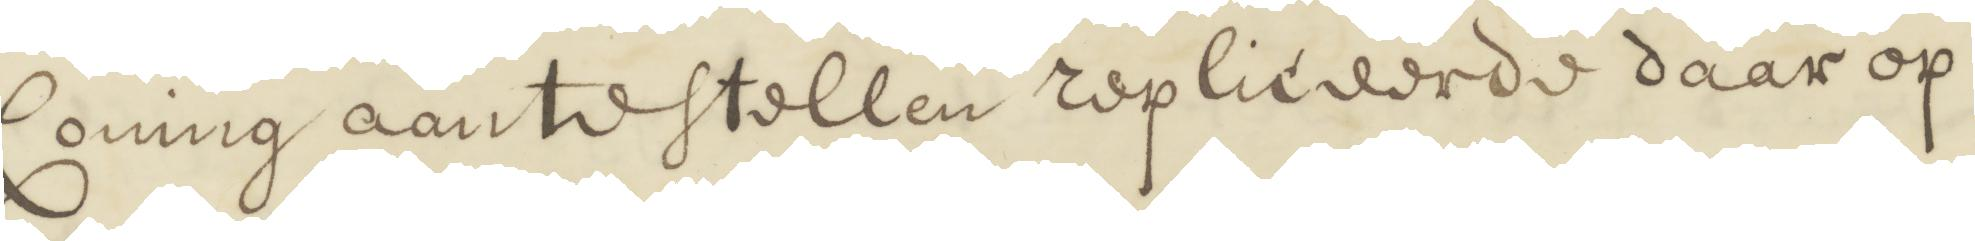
Coning aan te stellen repliceerde daar op
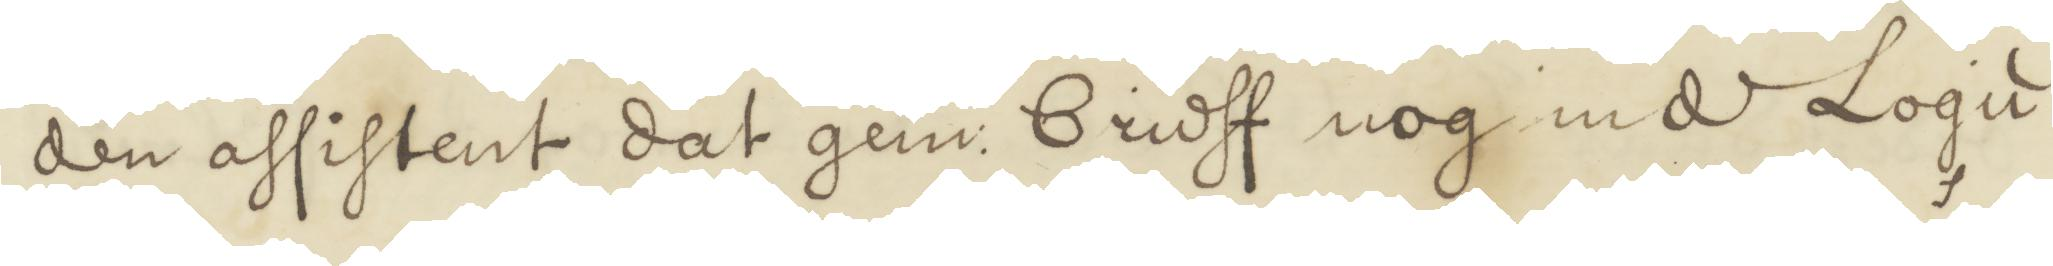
den assistent dat gem: brieff nog in de Logie
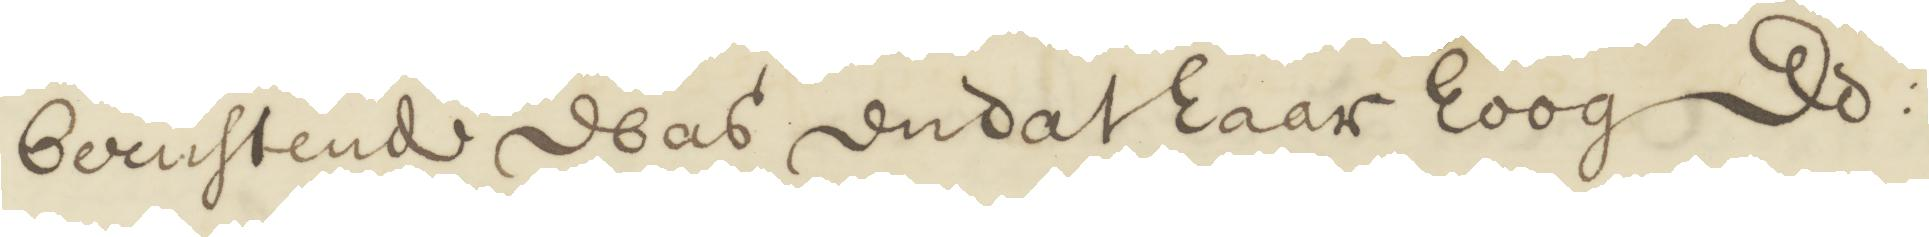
berustende was en dat haar hoog Ed:
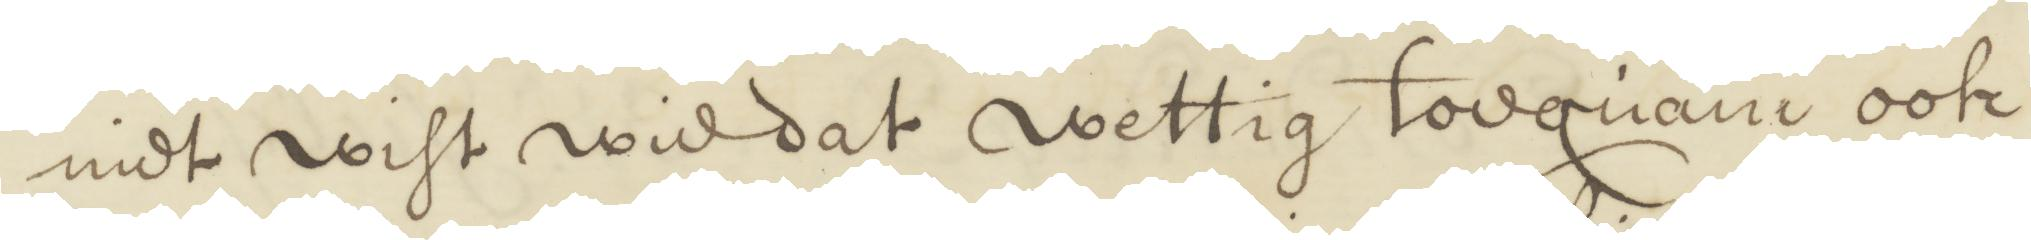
niet wist wie dat wettig toequam ook
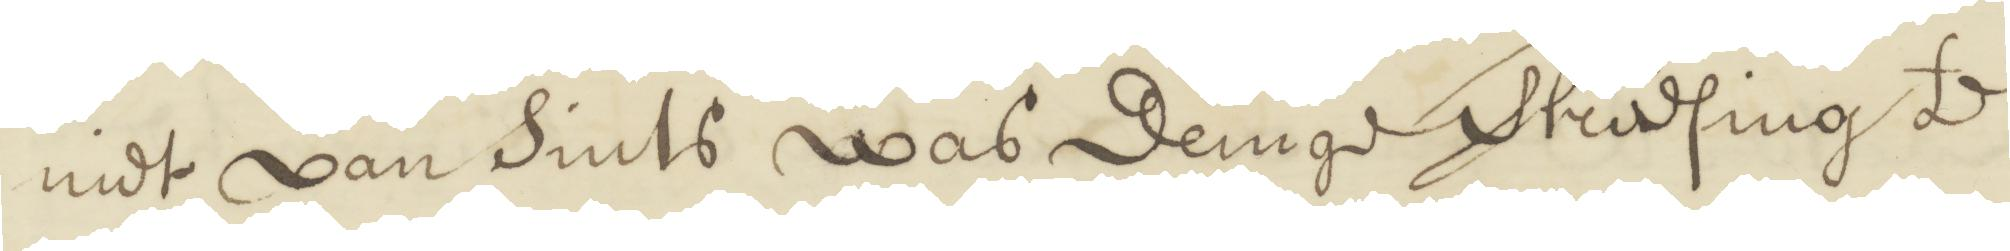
niet van sints was Eenige verkiesing te
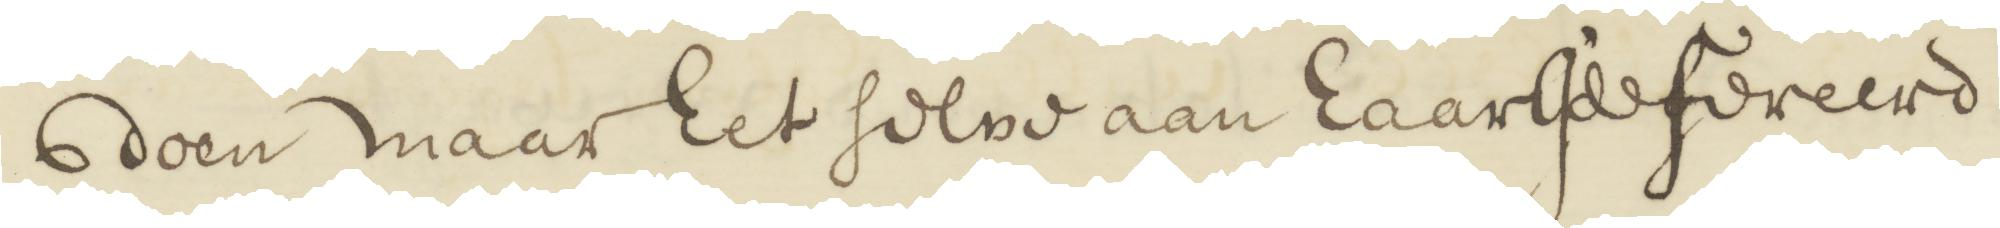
doen maar het selve aan haar g'defereerd
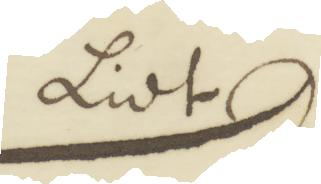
Liet
